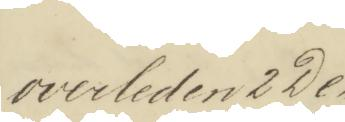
overleden 2 De
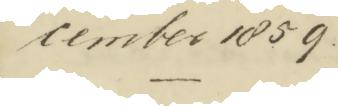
cember 1859
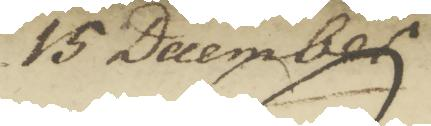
15 December
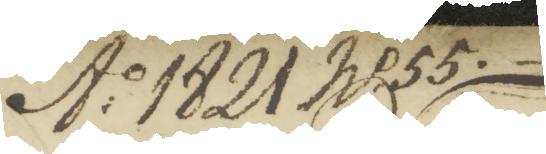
A:o 1821 N:o 55. -
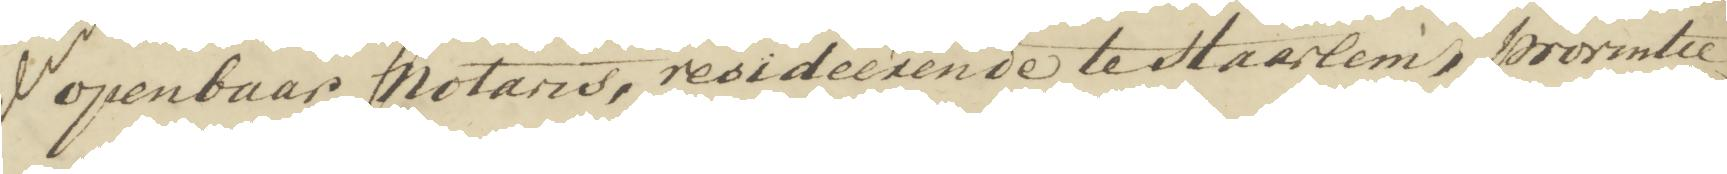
openbaar Notaris, resideerende te Haarlem, provintie
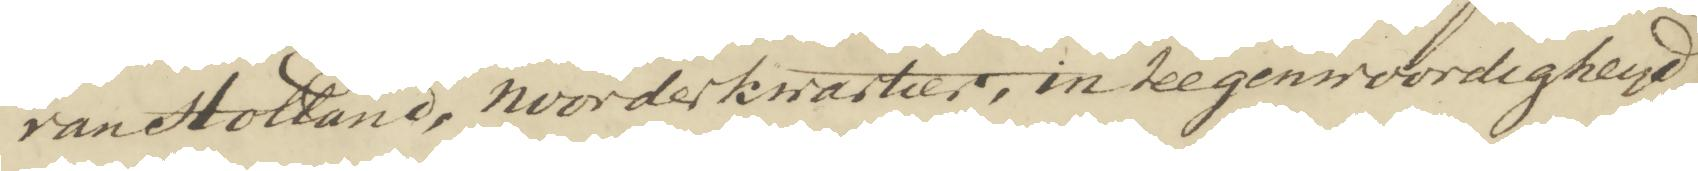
van Holland, Noorderkwartier, in teegenwoordigheyd
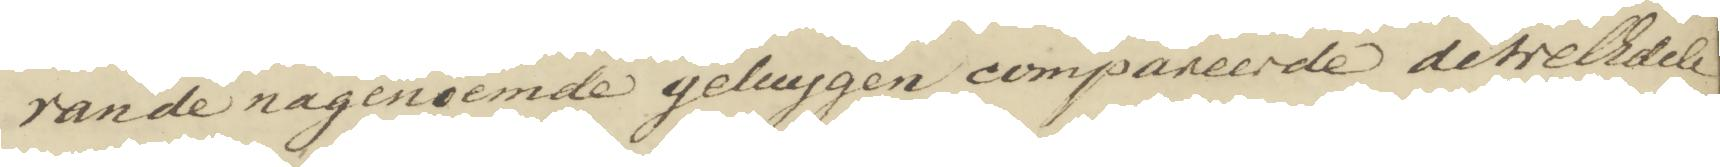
van de nagenoemde geluijgen compareerde de welEdelen
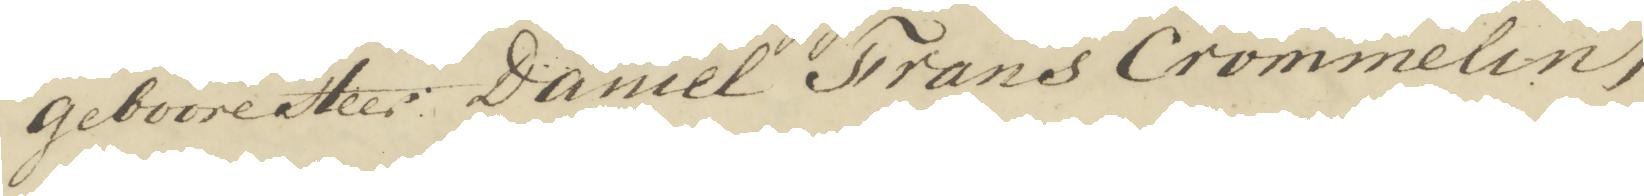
geboore Heer Daniel Frans Crommelin,
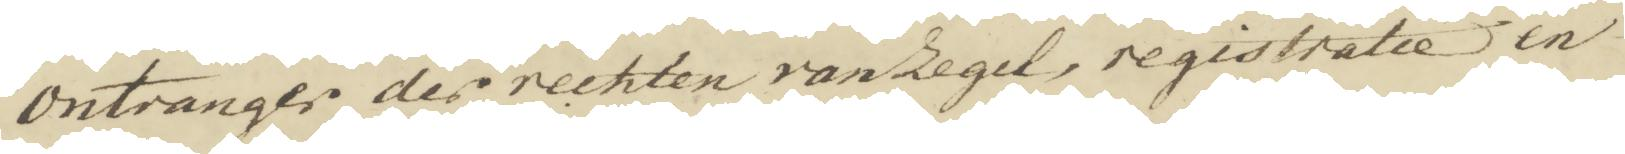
ontvanger der rechten van zegel, registratie en
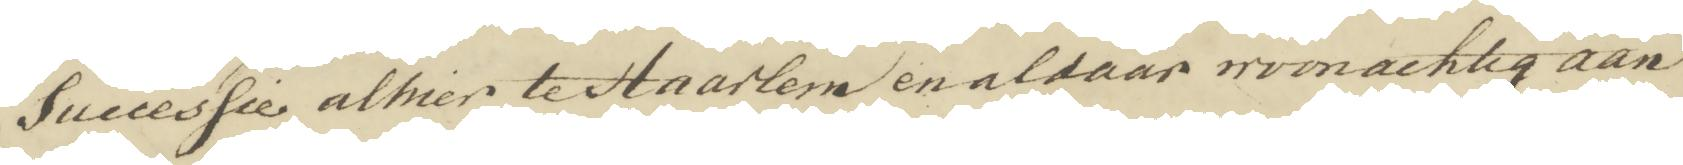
Successie alhier te Haarlem en aldaar woonachtig aan
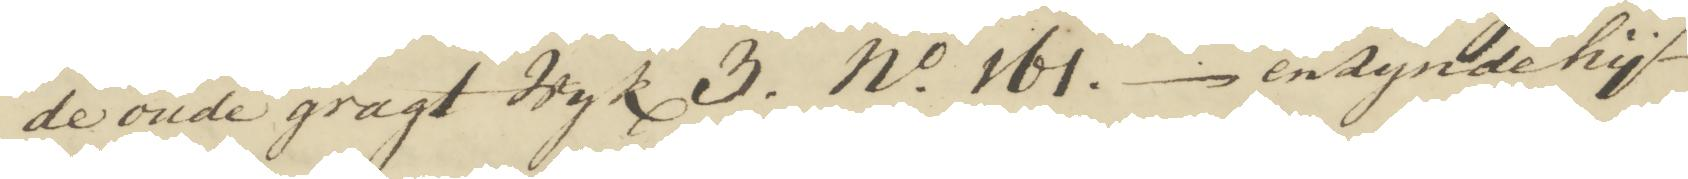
de oude gragt Wyk 3. N.o 161. — en zynde hij
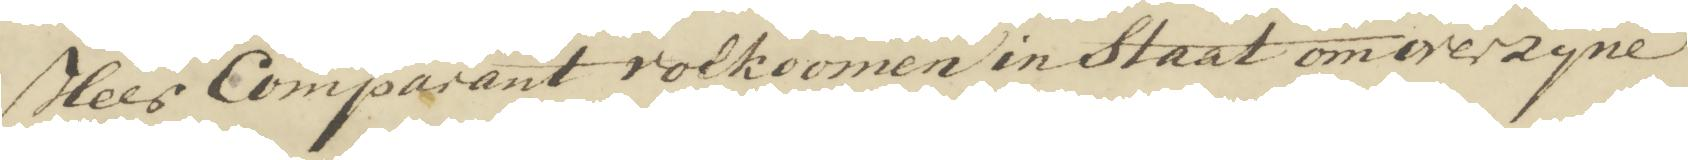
Heer Comparant volkoomen in staat om over zyne
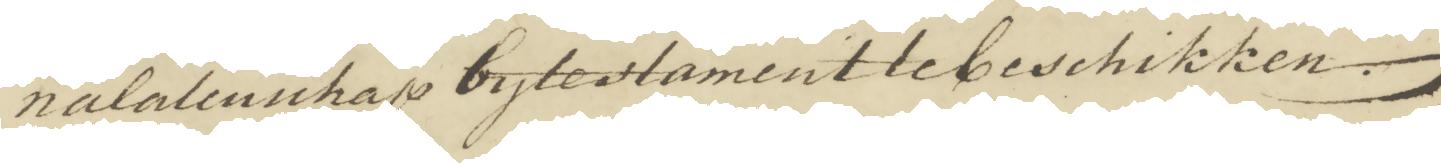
nalatenschap bytestament te beschikken.
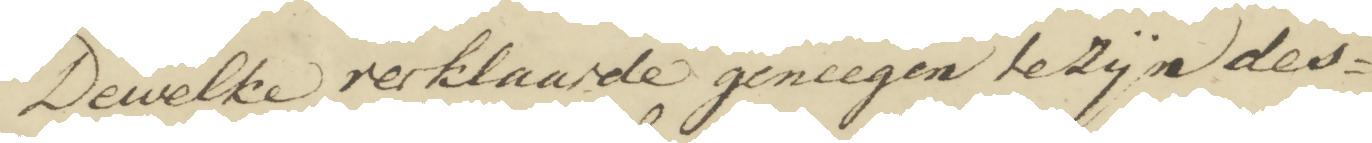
Dewelke verklaarde geneegen te zijn des=
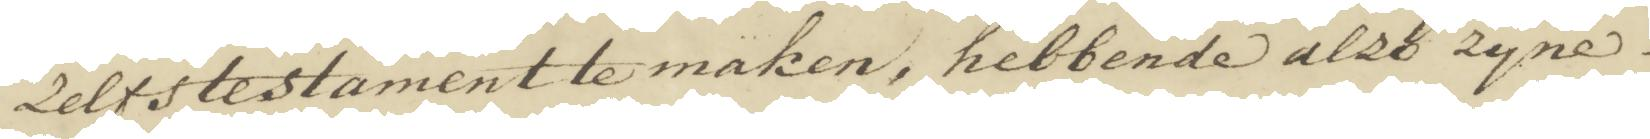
zelfs testament te maken, hebbende alzo zyne
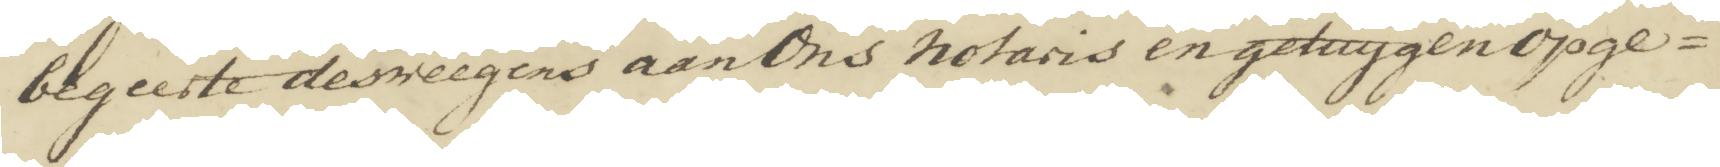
begeerte desweegens aan ons notaris en getuijgen opge=
